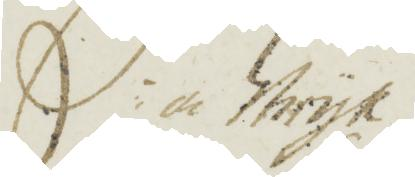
O. de Wijk
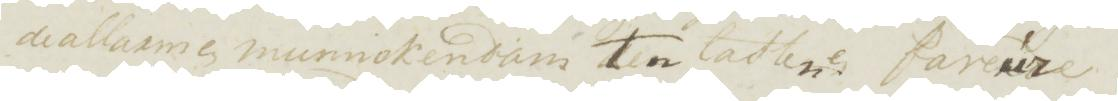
de allarm en munnickendam ten lasten en faveure
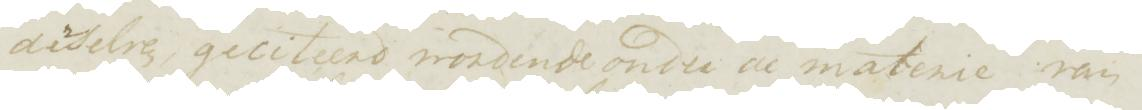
derselve, geciteerd wordende onder de materie van
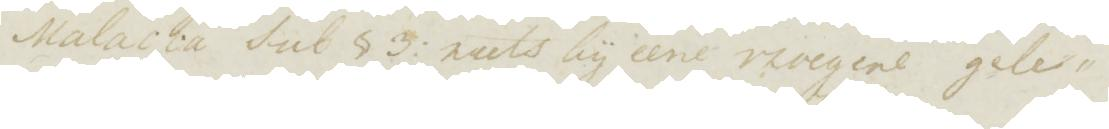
Malacca Sub § 3: reets bij eene vroegere gele„
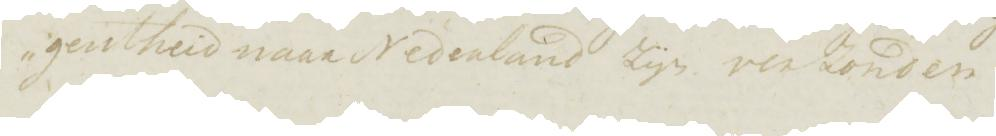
„genheid naar Nederland zijn verzonden
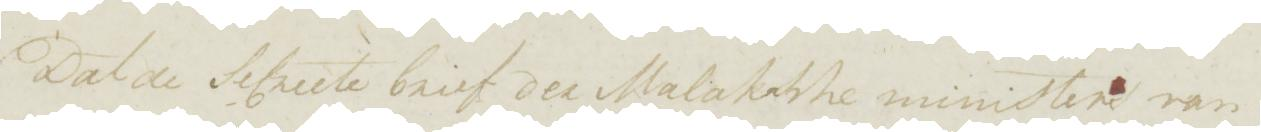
Dat de secreete brief der Malakasche ministers van
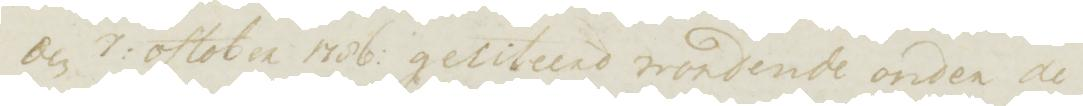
den 7: october 1786: geciteerd wordende onder de
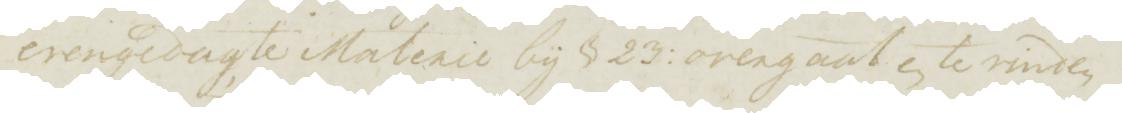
evengedagte Materie bij § 23: overgaat en te vinden
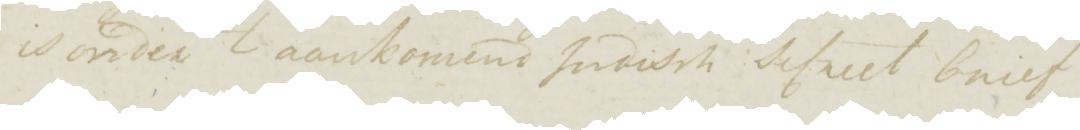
is onder t aankomend Indisch secreet brief
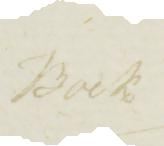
Boek
